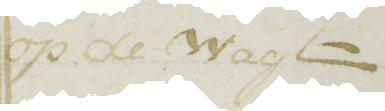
op de wagt
